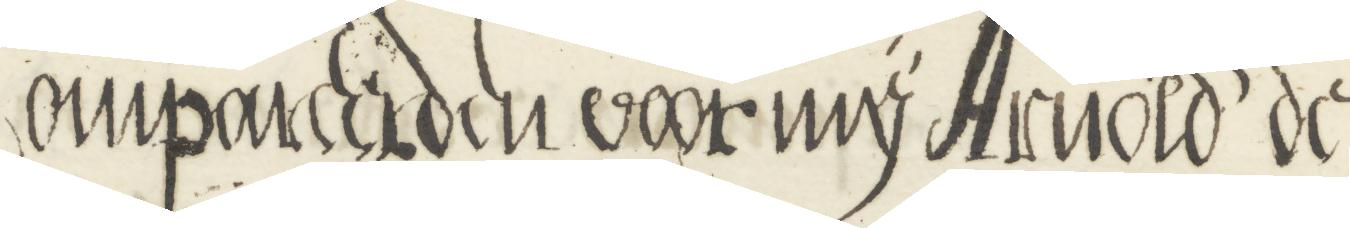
Compareerden vor mij Arnold' de
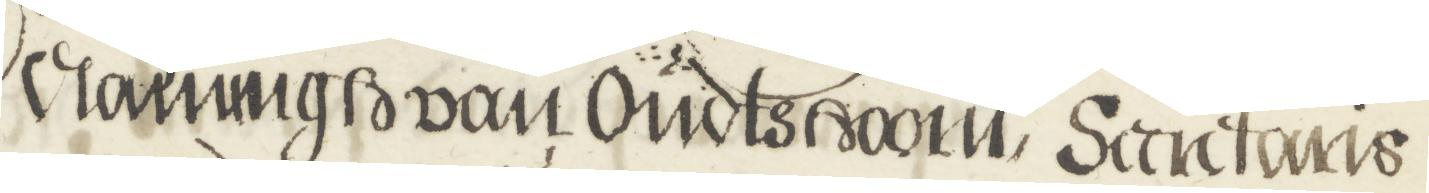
vlamingh van Oudtshoorn, Secretaris
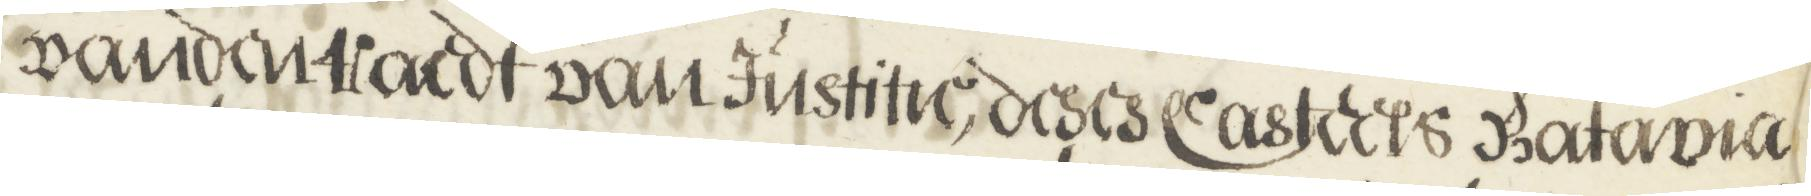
van den raedt van Iustitie, deses casteels Batavia,
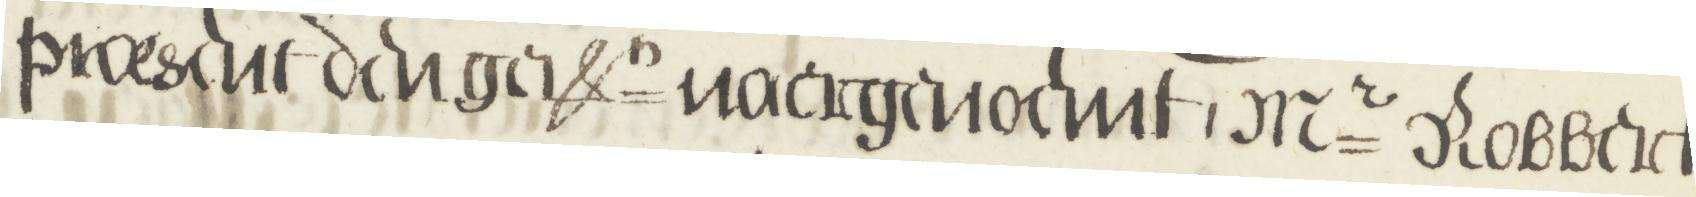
praesent den get&=n naergenoemt, M=r Robbert
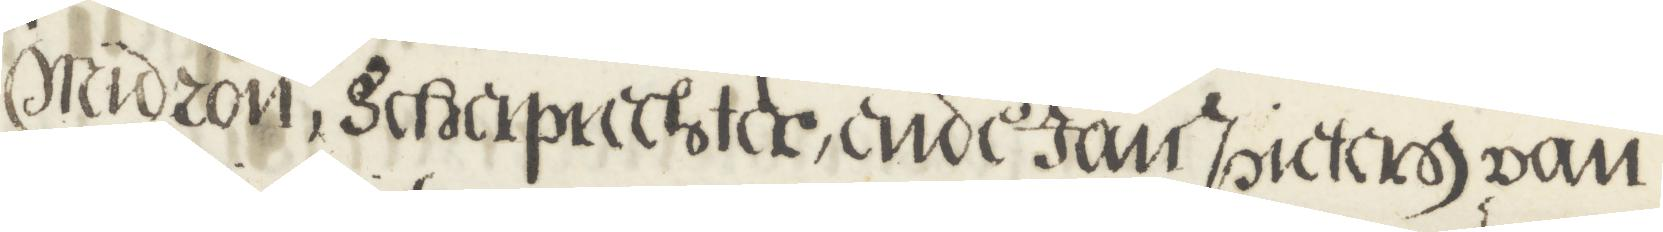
Midzon, scherprechter, ende Ian Pietersz van
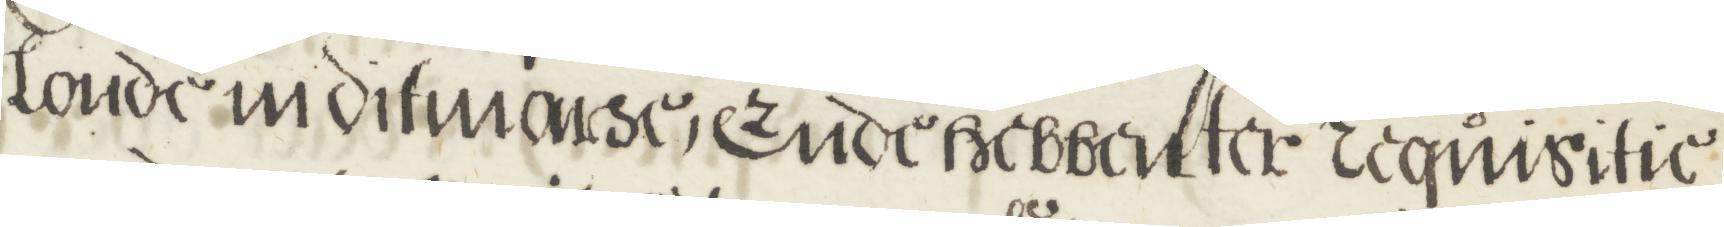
Londe in ditmarse, Ende hebben ter requisitie
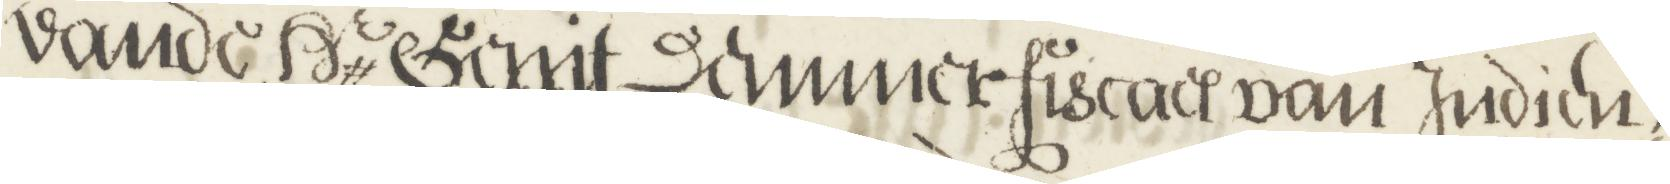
vande h„e Gerrit demmer fiscael van Jndien,
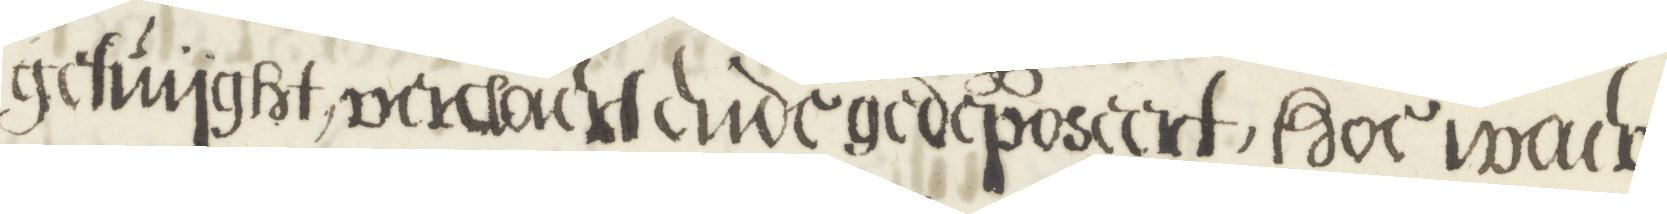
getuijght, verclaert ende gedeposeert, hoe waer
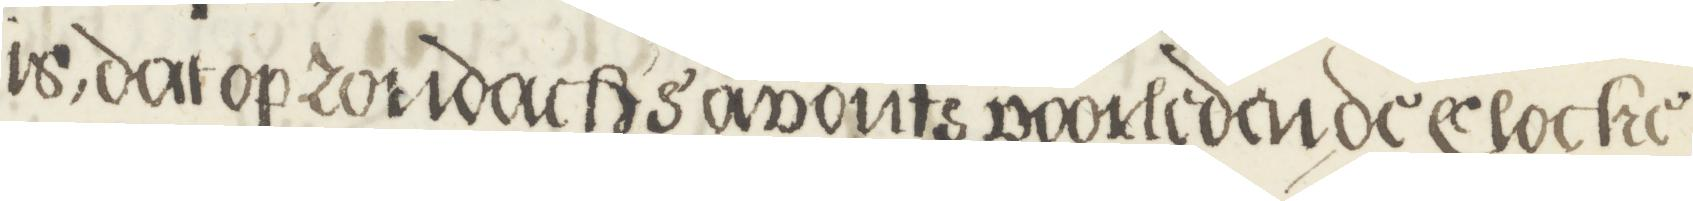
is, dat op zondachs avonts voorleden de clocke
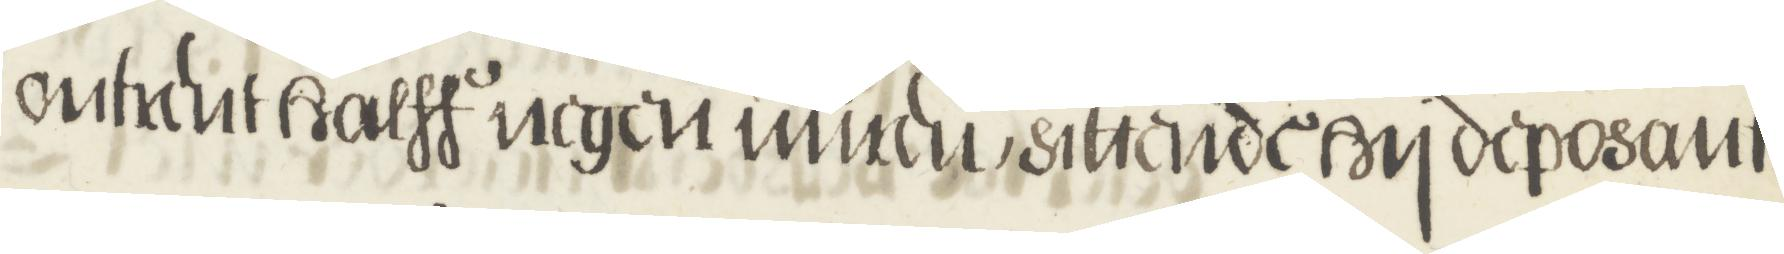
ontrent halff negen uuren, sittende hij deposant
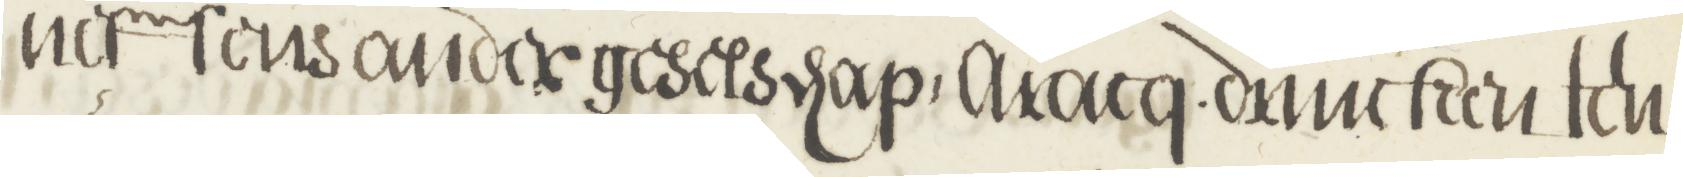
neffens ander geselschap Aracq. drincken ten
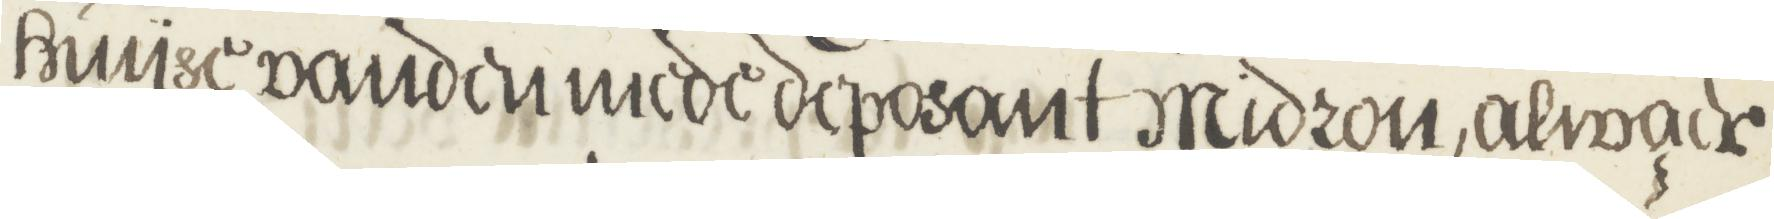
huijse vanden mede deposant Midzon, alwaer
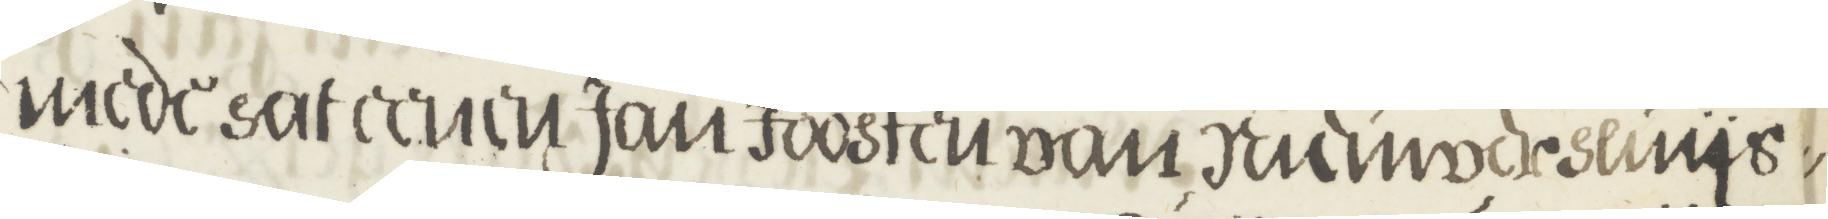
mede sat eenen Jan Ioosten van Nieuwersluijs
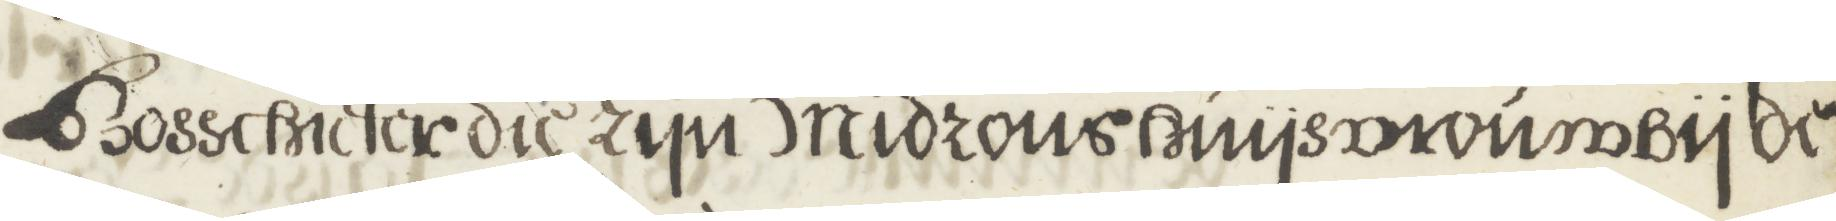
Bosschieter die zijn Midzons huijsvrouw bij de
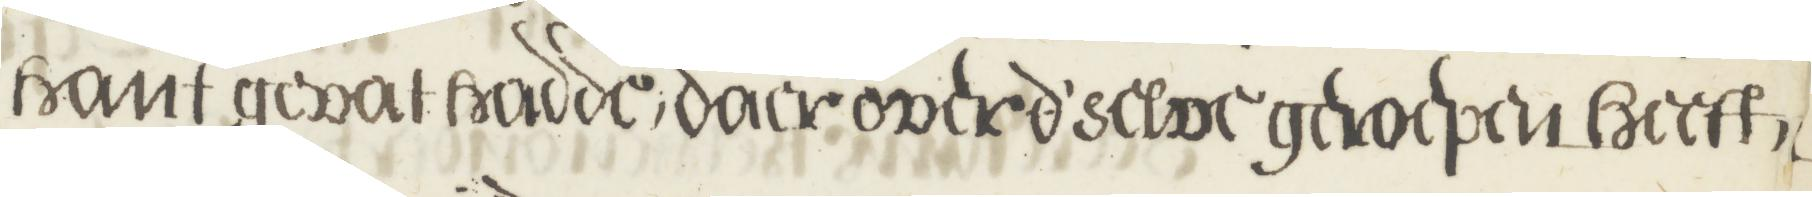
hant gevat hadde, daer over d’selve geroepen heeft,
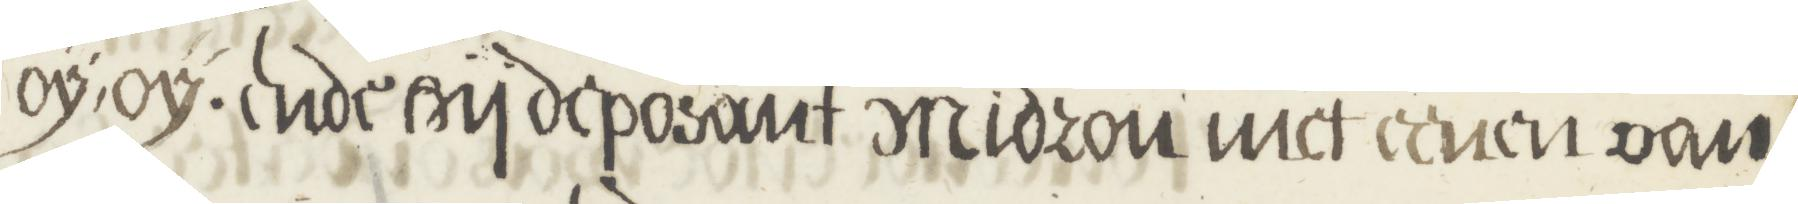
oij, oij. ende hij deposant Midzon met eenen van
